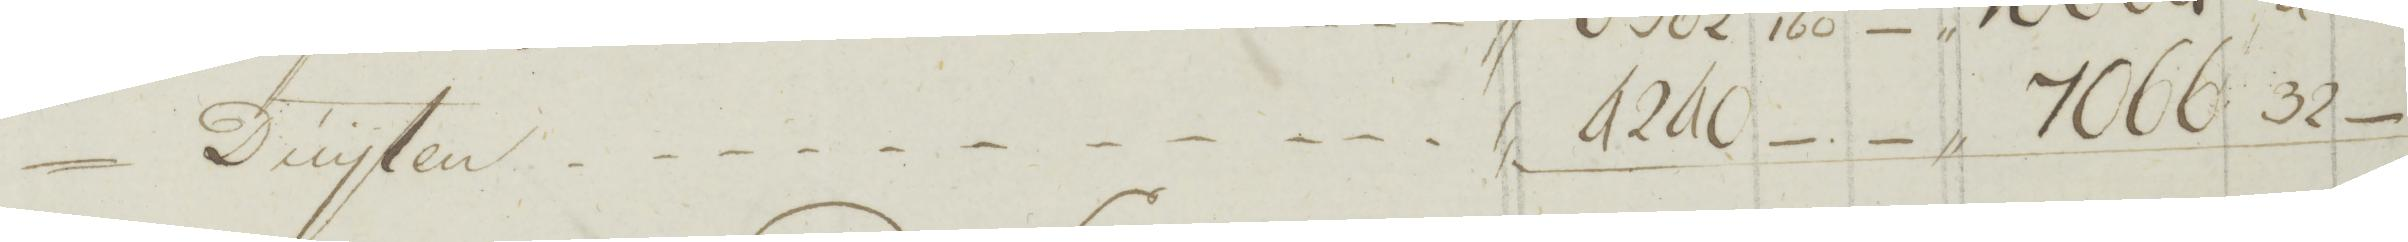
= Duijten - - - - - - - - - - - „4240 – . – „ 7066 32 –
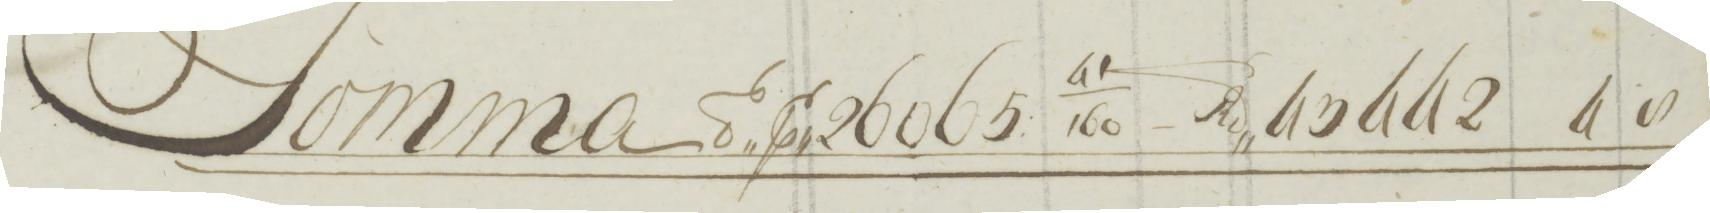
Somma d„s p„r 26065: 41/160 Rd„s 43442 4 8
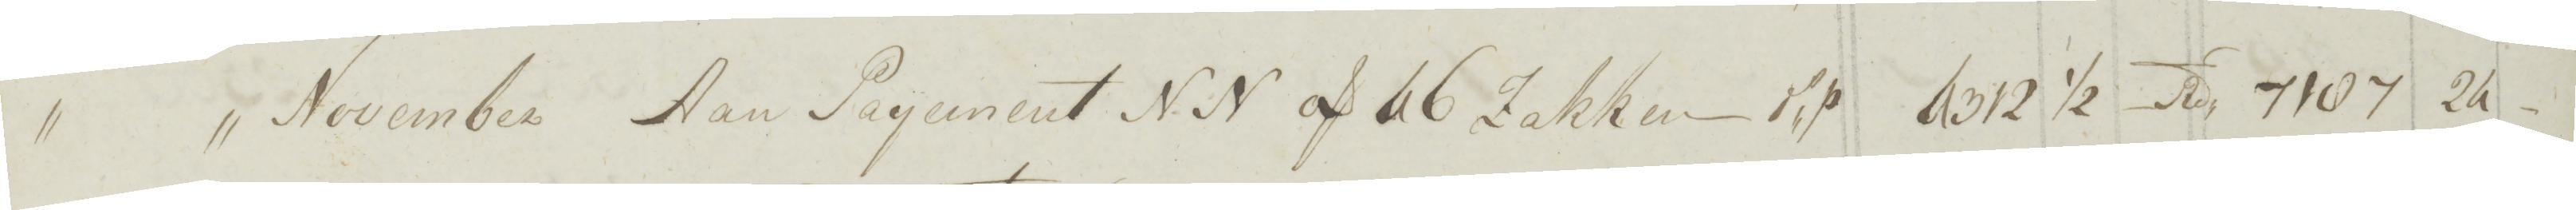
„ „ November Aan Paijement N N over 46 zakken d„s p 4312 ½ Rd„s 7187 24 –
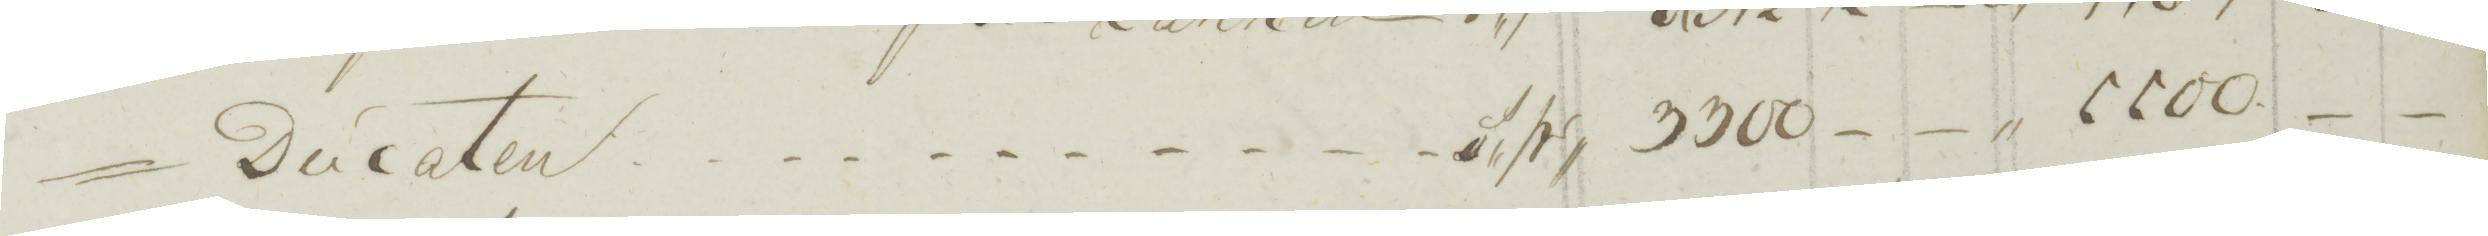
= Ducaten - - - - - - - - - – - d„s p„r 3300 – – „ 5500 – –
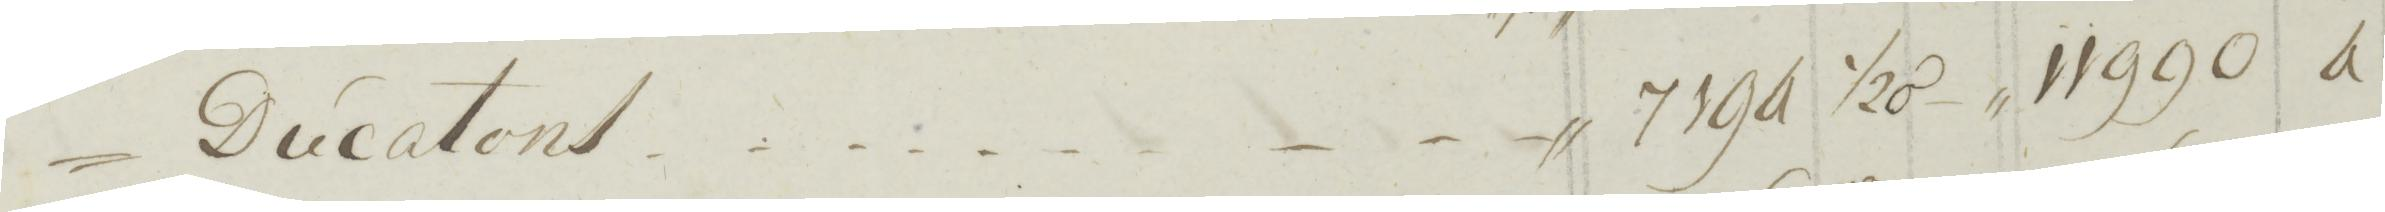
= Ducatons - - - - - - - – – – „ 7194 1/20 – „ 11990 4 –
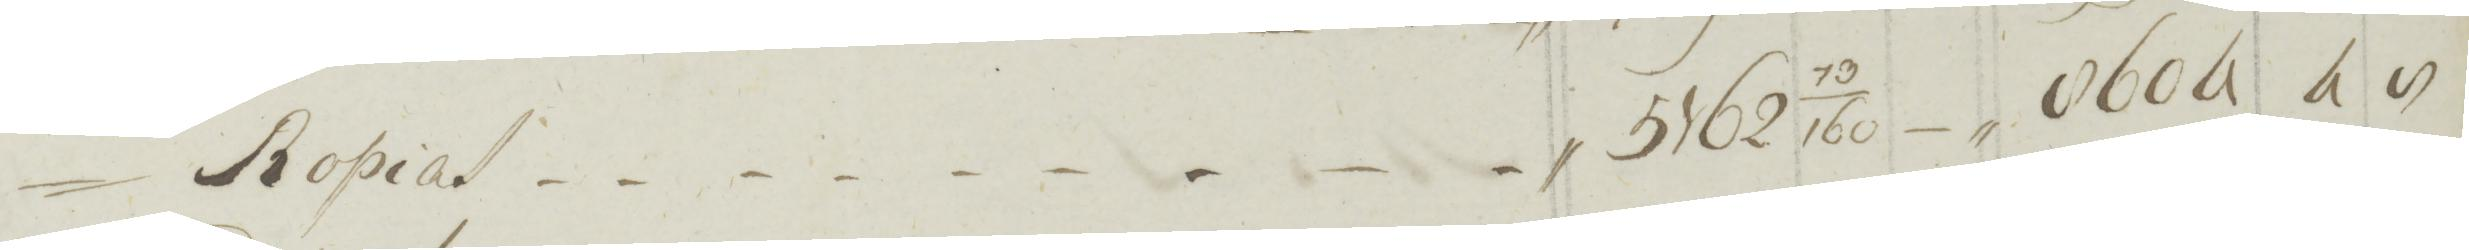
= Ropias – – – – – – – – – „ 5162 73/160 – „ 8604 4 8
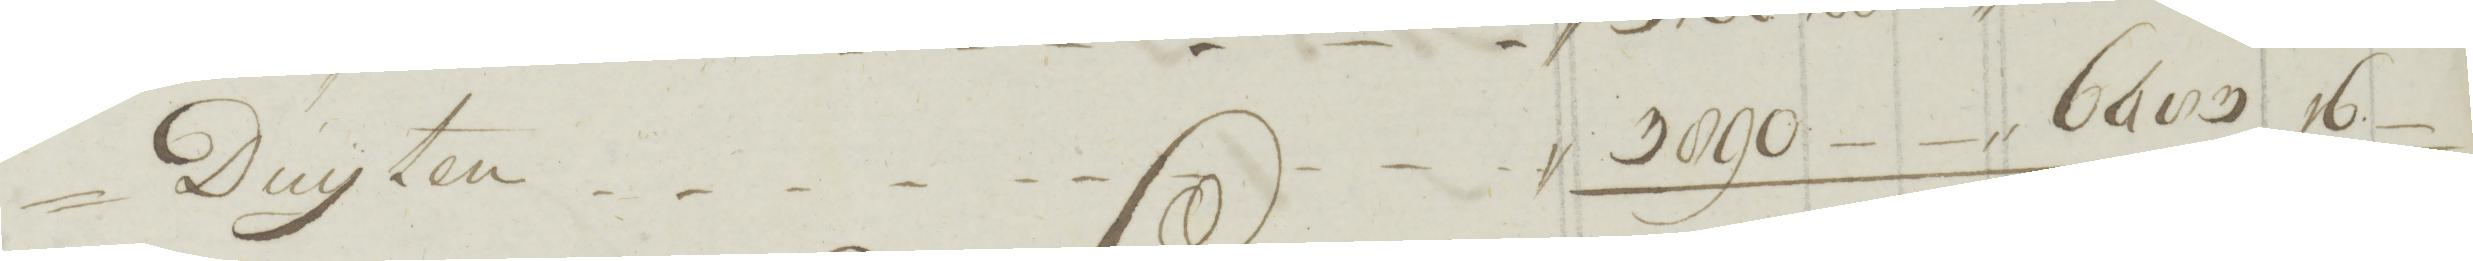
= Duijten - – – – – – – – – - „ 3890 – – „ 6483 16. –
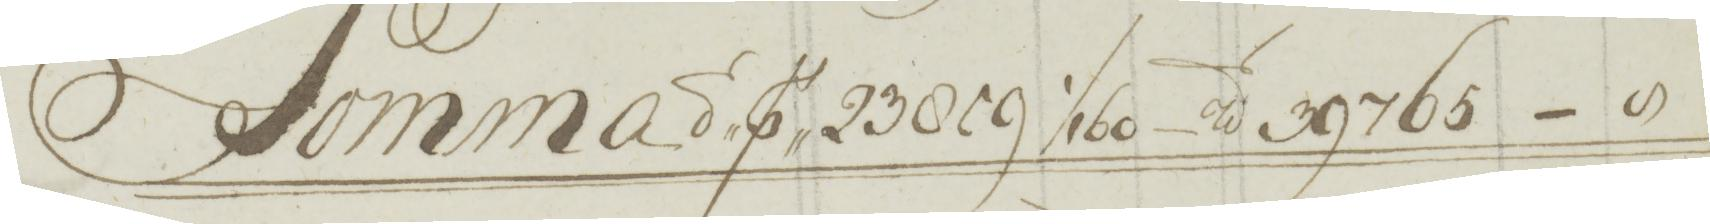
Somma d„s p„r 23859 1/160 – rd.s 39765 – 8
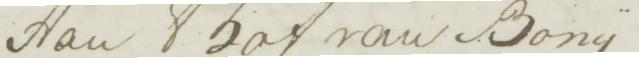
Aan 't hof van Bonij
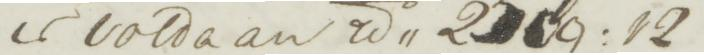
is voldaan rd„s 2509:12
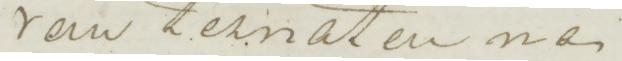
van ternaten na
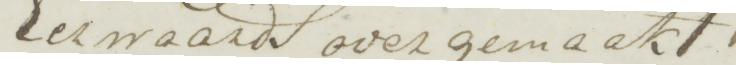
herwaards over gemaakt
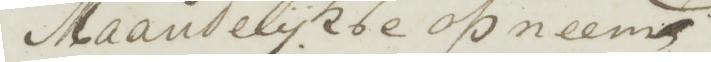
Maandelijkse opneem
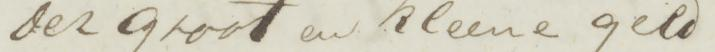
der groot en kleene geld
